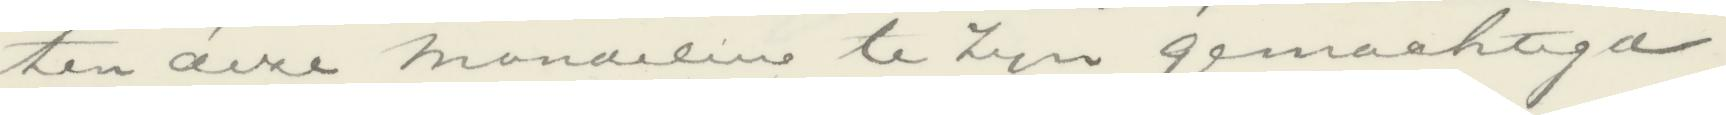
ten deze mondeling te zyn gemachtigd
